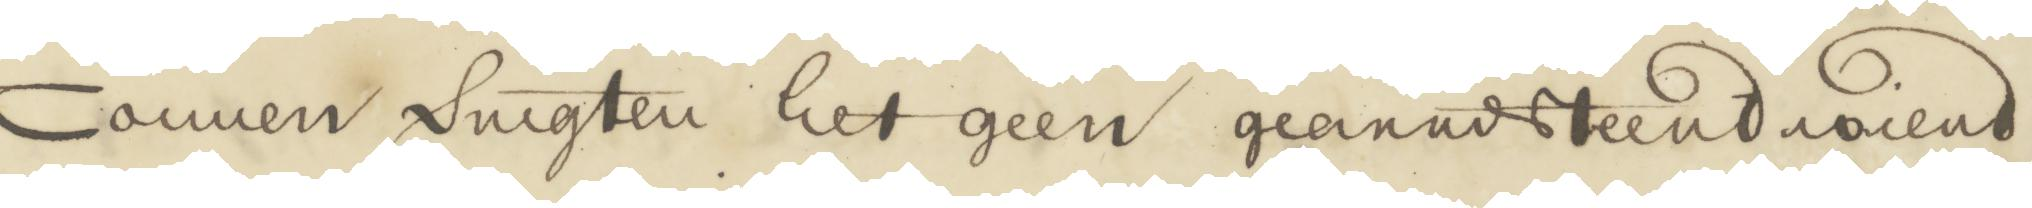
Connen verrigten het geen gearresteerd wierd
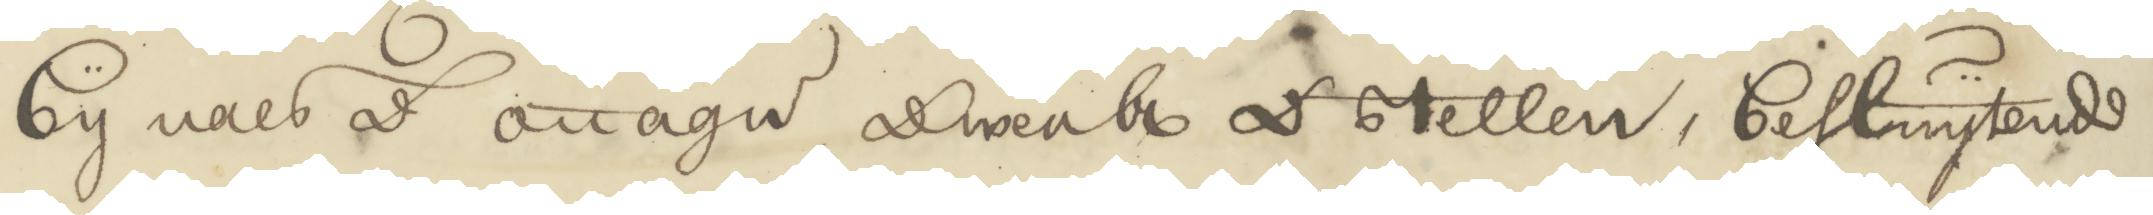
bij naeste occagie te werk te stellen, besluijtende
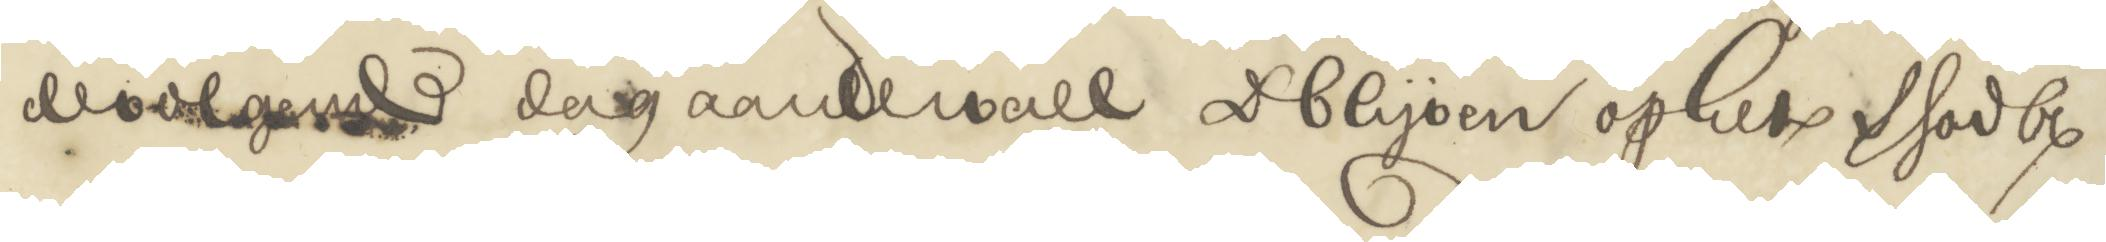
de volgende dag aandewall te blijven op het versoek
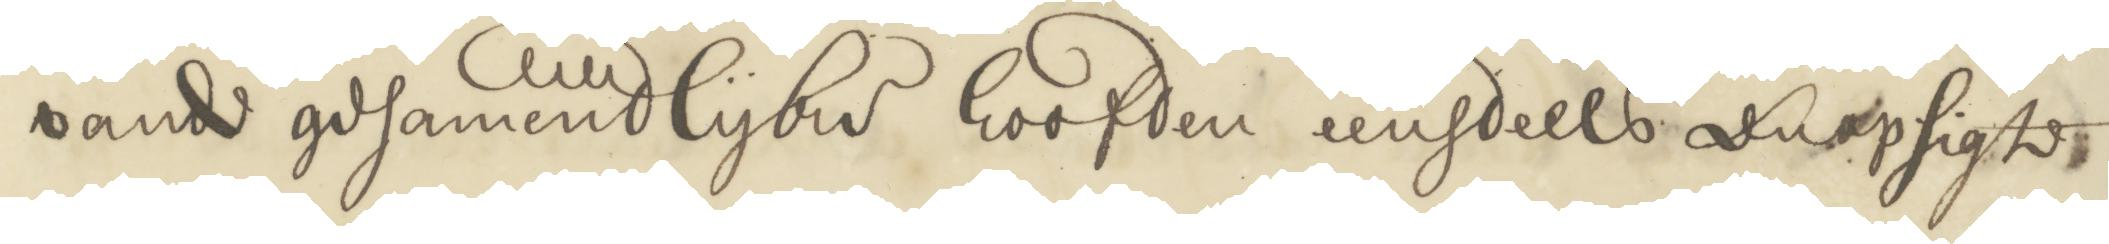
vande gesamendlijke hoofden eensdeels ten opsigte
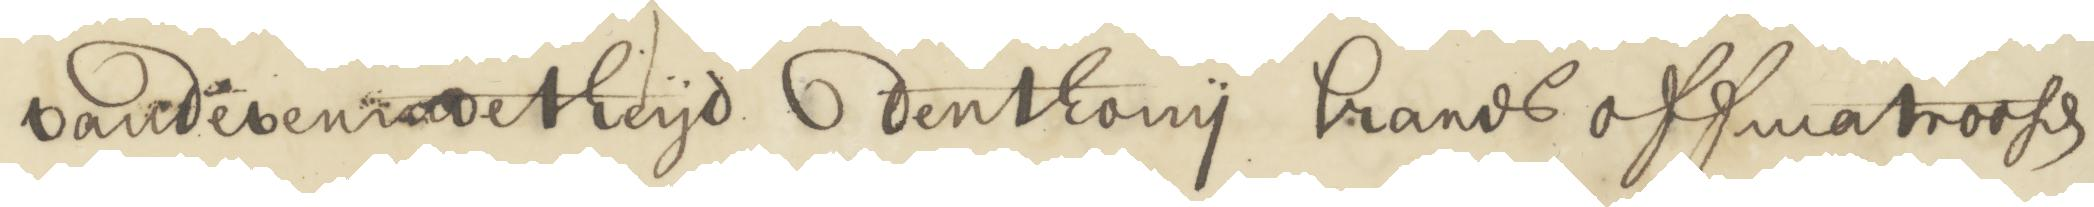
vande vermoetheijd der thonij kares off matroosen
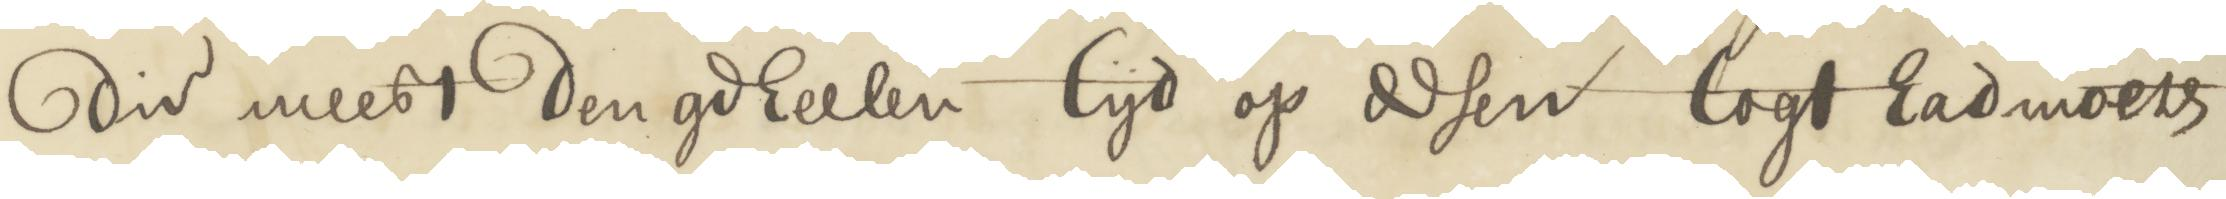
die meest den geheelen tijd op desen togt had moeten
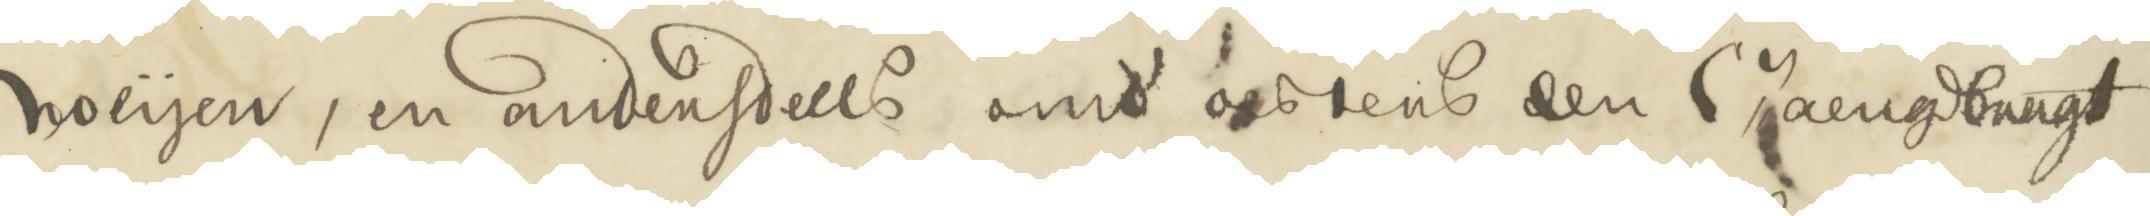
roeijen, en andersdeels omd' oesters den 5„en aengebragt
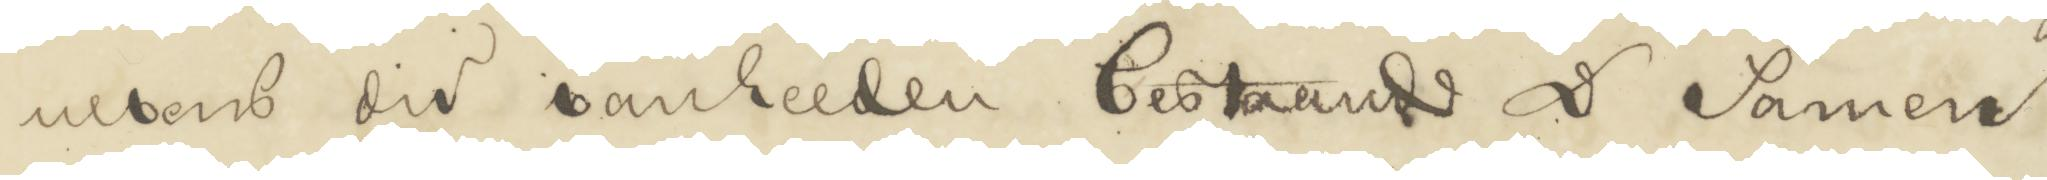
nevens die vanheeden bestaande te Samen
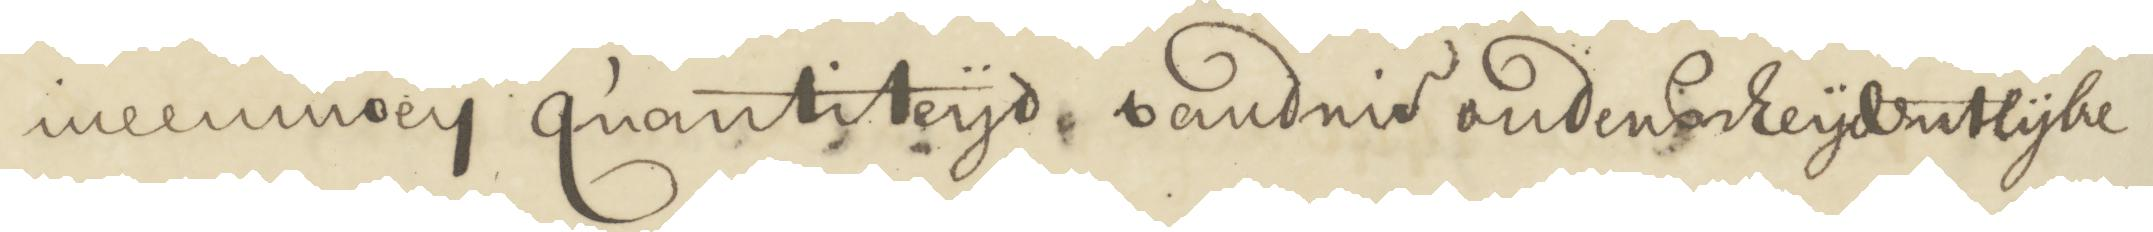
in een moeij quantiteijd, van drie onderscheijdentlijke
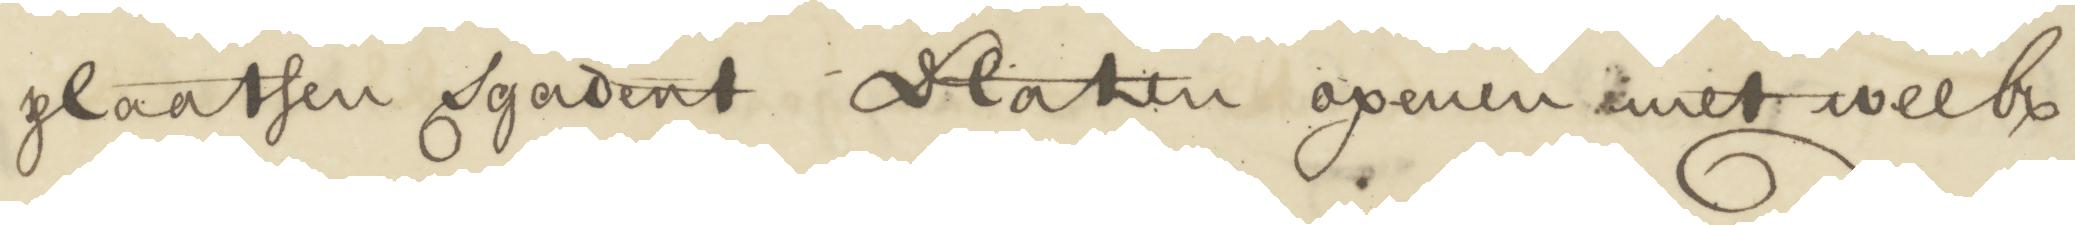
plaatsen vergadert te laten openen met welk
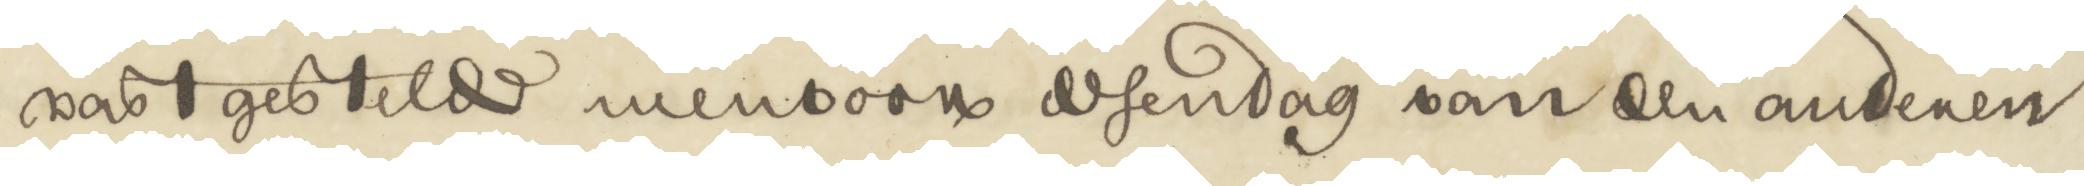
vast gestelde menvoor desendag van den anderen
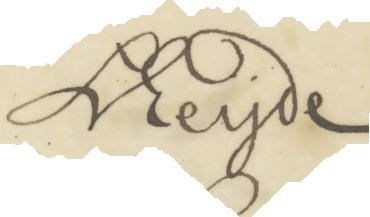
Scheijde
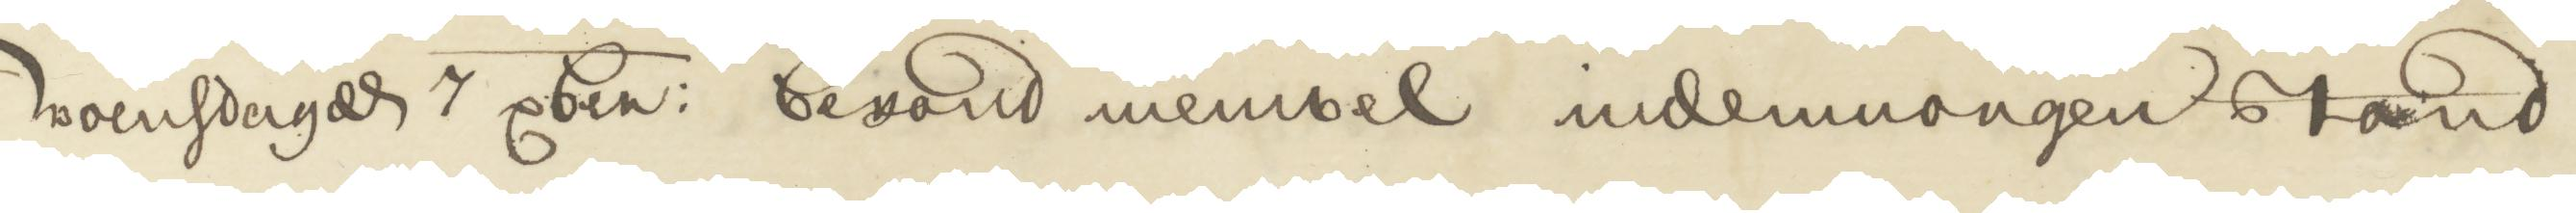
woensdag den 7 xber: bevond men wel indenmorgen stond
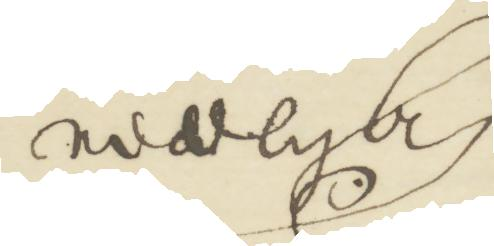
redelyk
